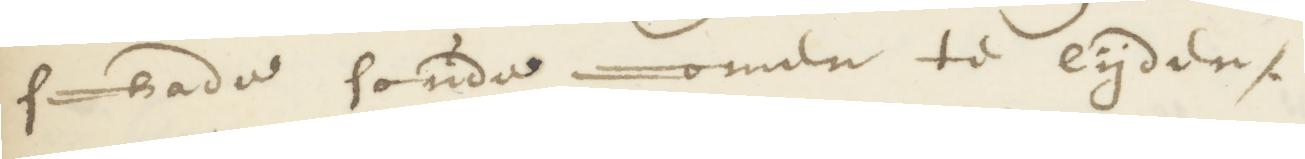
schade soude comen te lijden/.
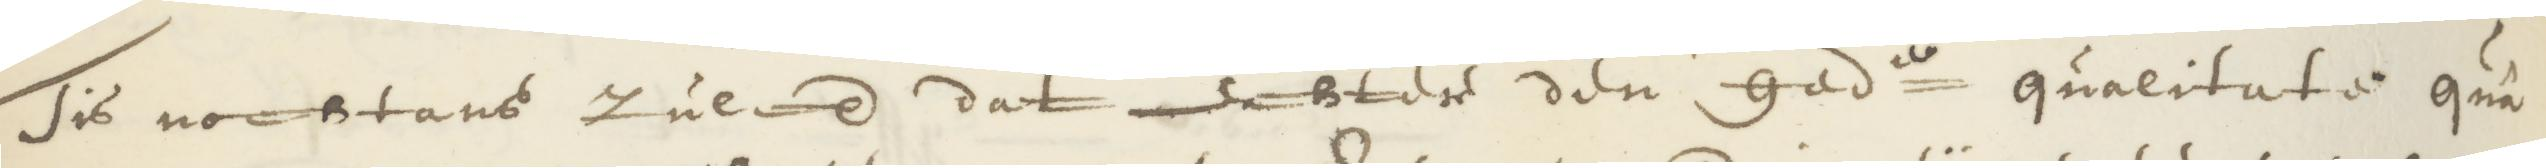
Tis nochtans zulcx dat eerster den ged=e qualitate quâ
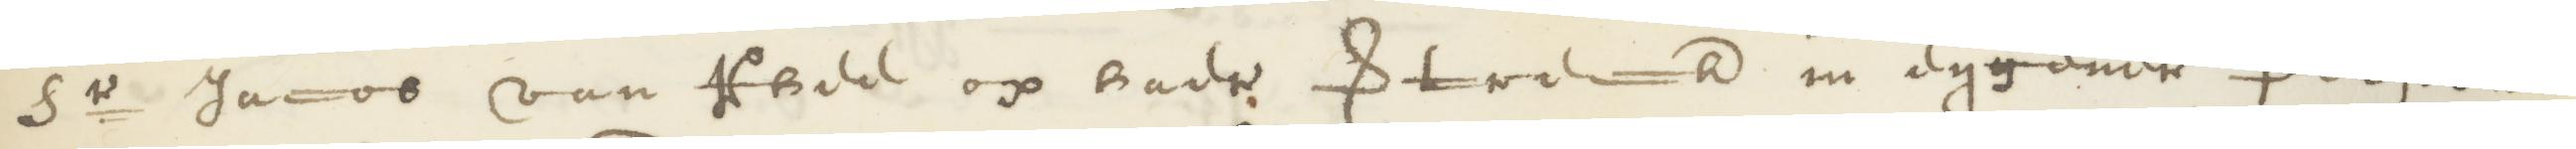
h=r Jacob van Rhee op haer vertreck in eijgener persoon-
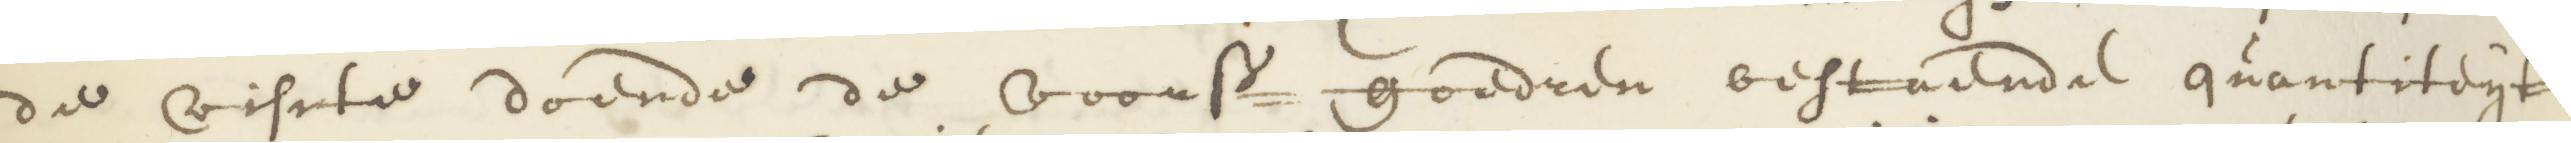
de visite doende de voors=z goedren bestaende quantiteijt
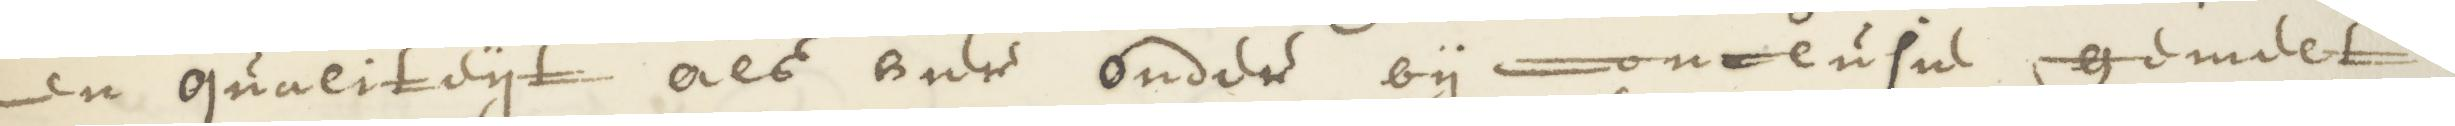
en qualiteijt als hier onder bij conclusie gemelt
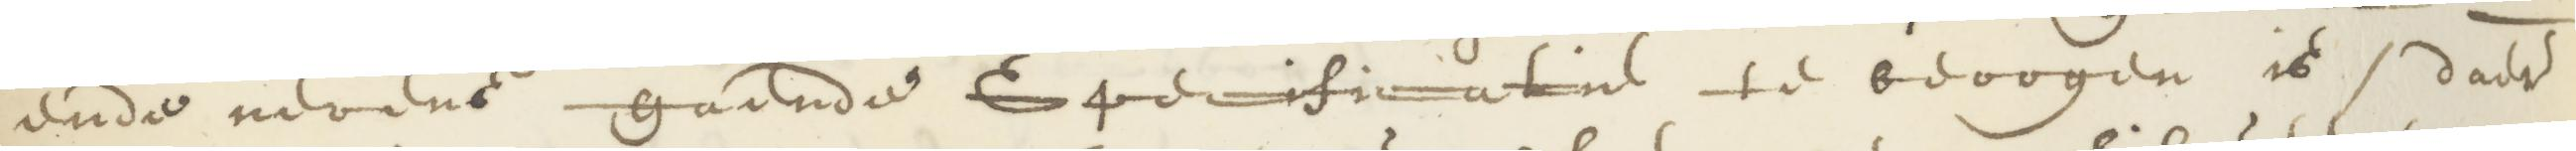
ende nevens gaende Specificatie te beoogen is, daer
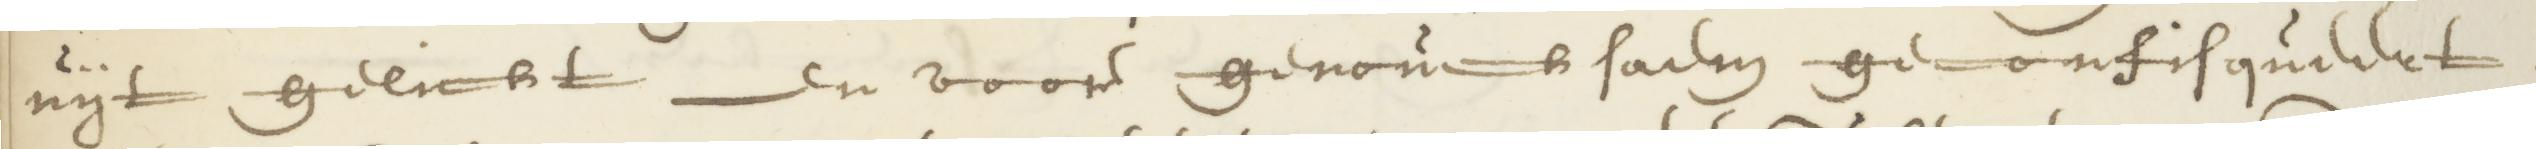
uijt gelicht en voor genouchsaem geconfisqueert
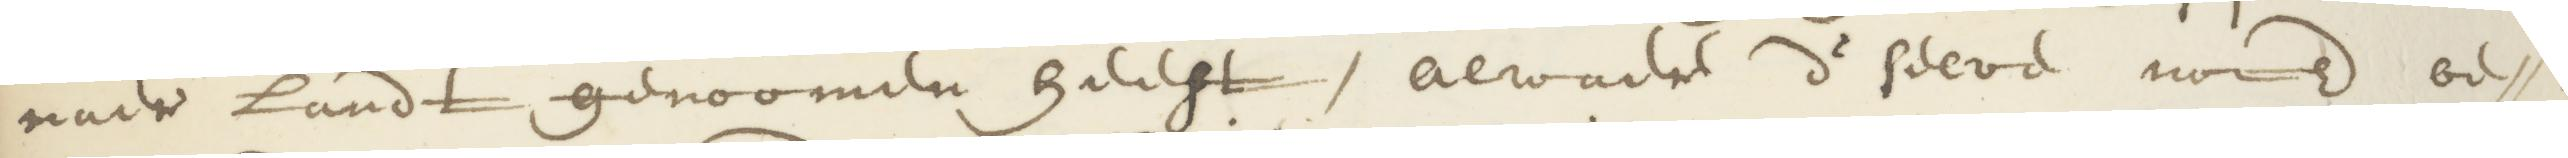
naer Landt genoomen heeft, alwaer d’ selve noch be„
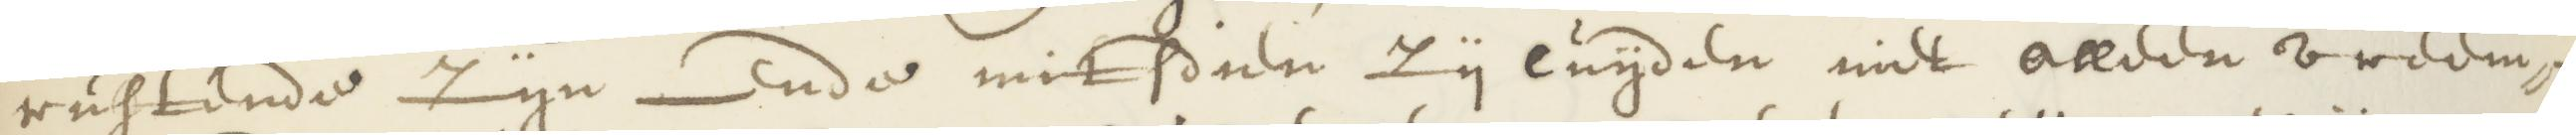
rustende zijn ende mitsdien zij luijden niet alleen vreem„
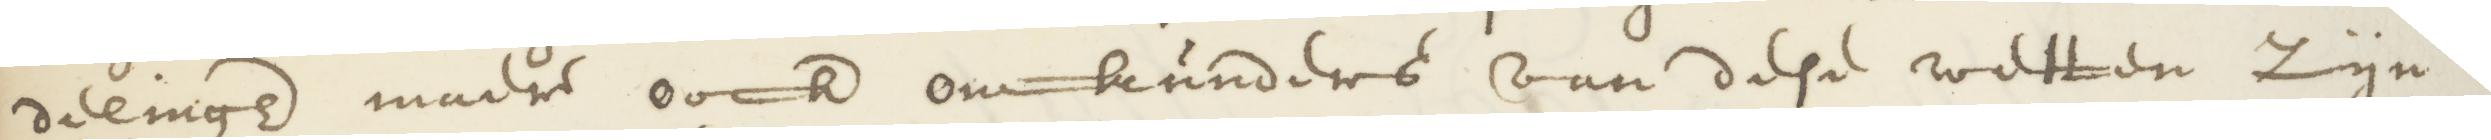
delingh maer oock onckunders van dese wetten zijn.
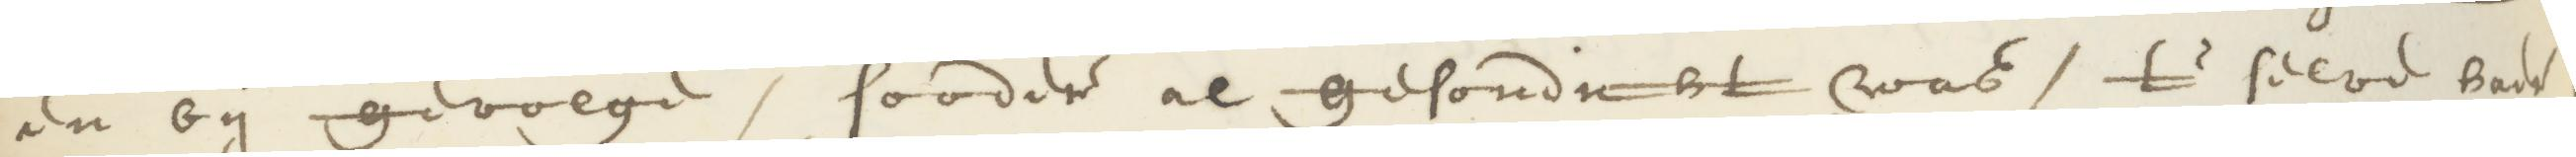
en bij gevolge, sooder al gesondicht was, t' selve haer
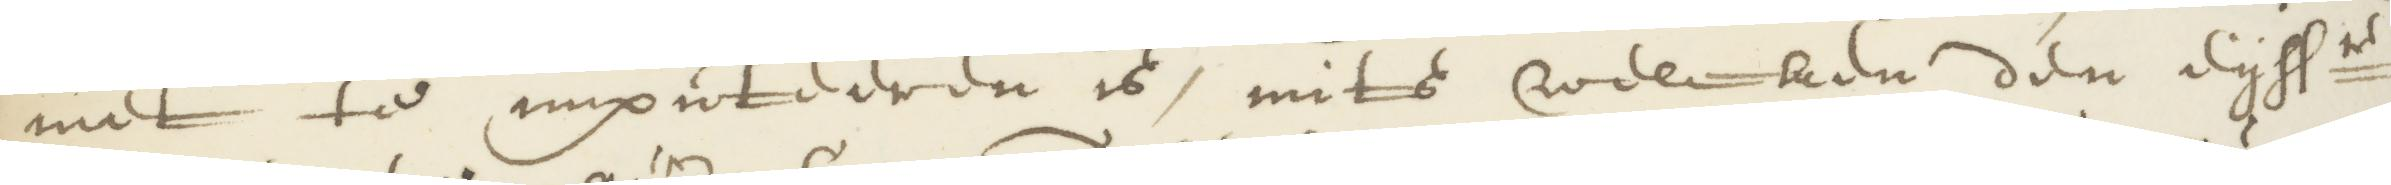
niet te imputeeren is, mits welcken den eijss=r
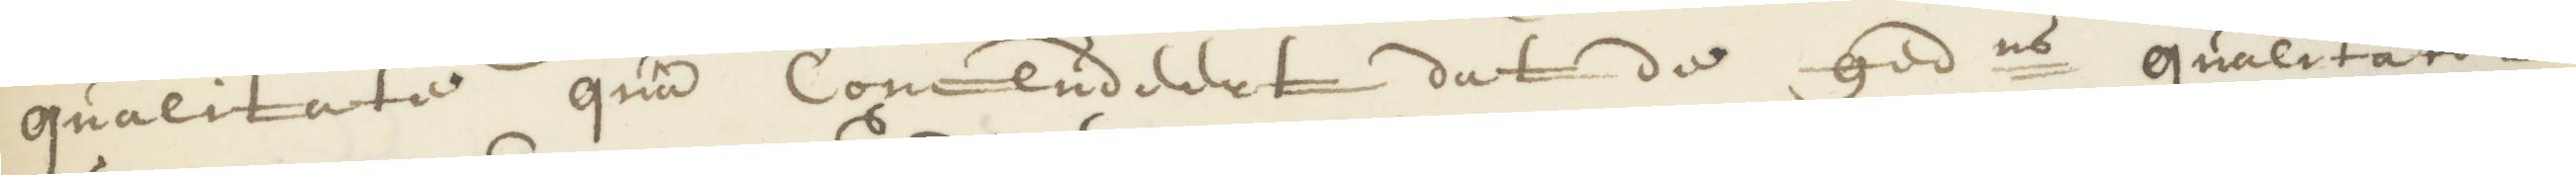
qualitate quâ Concludeert dat de ged=ns qualitate —
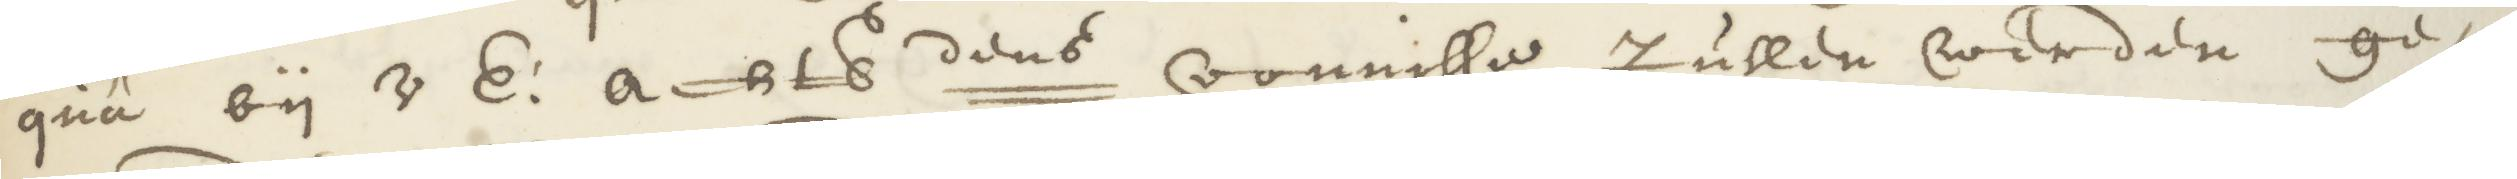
quâ bij v E: achtb=dens vonnisse zullen werden ge„
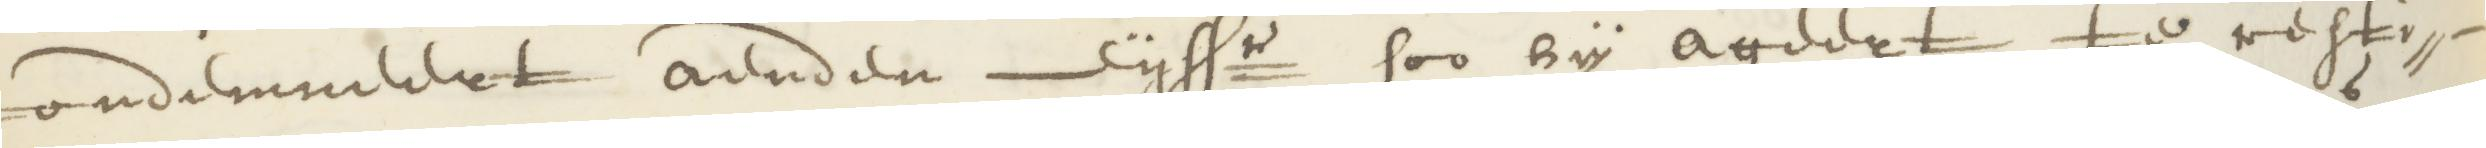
condemneert aen den eijss=r soo hij ageert te resti„-
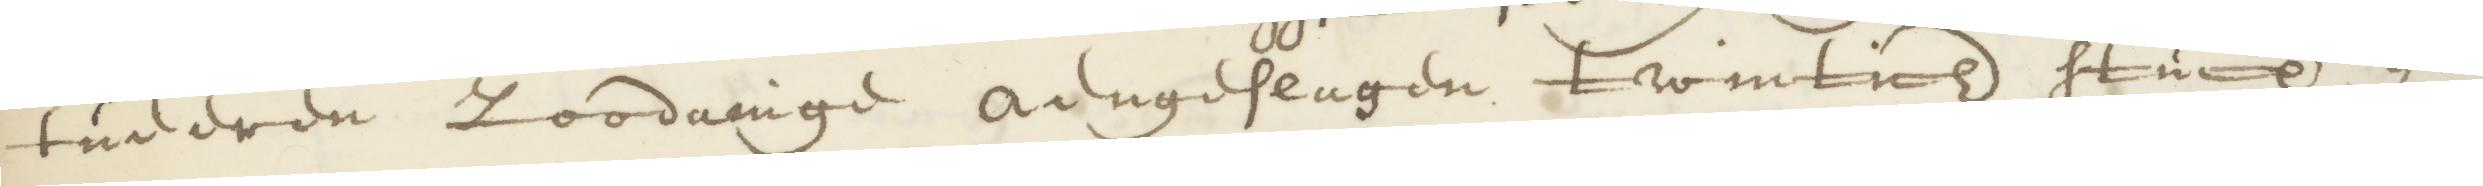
tueeren zoodanige aengeslagen twintich stucx g=s
